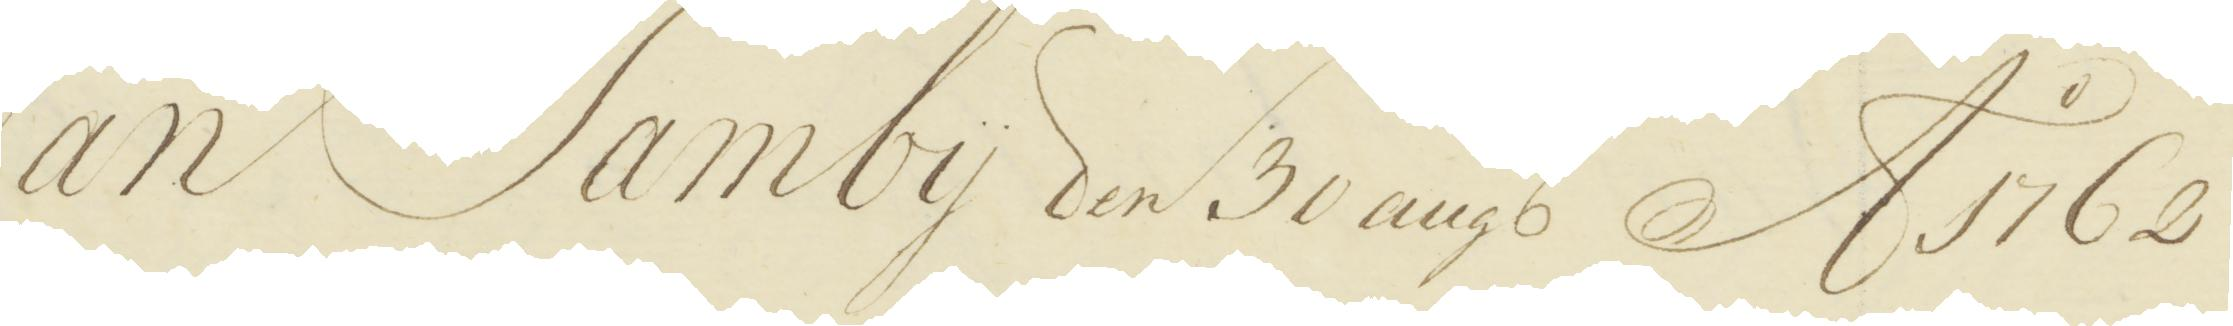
Van Jambij den 30 augs Ao 1762
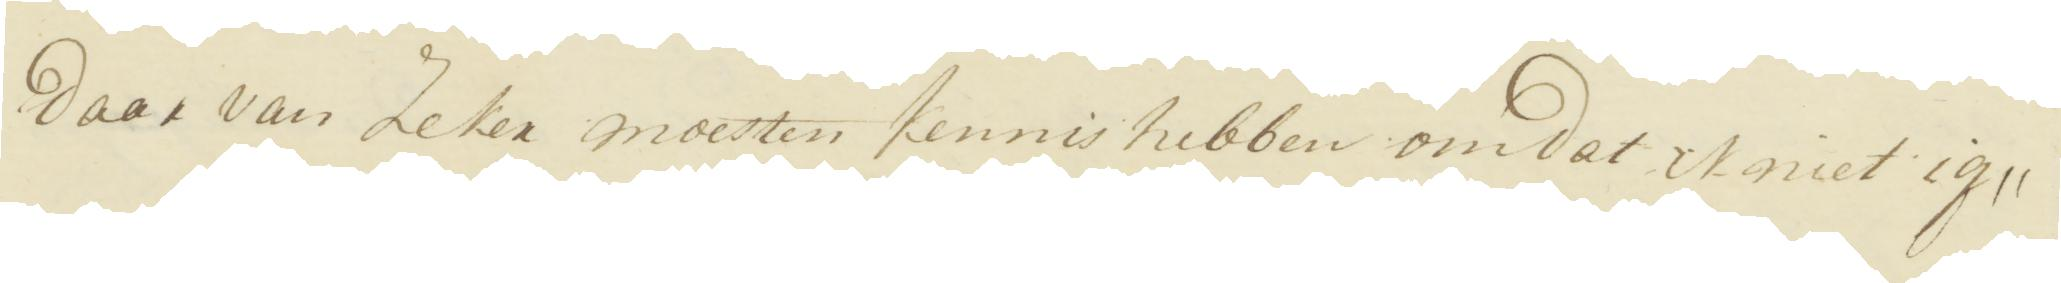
daar van zeker moesten kennis hebben omdat ik niet ig„
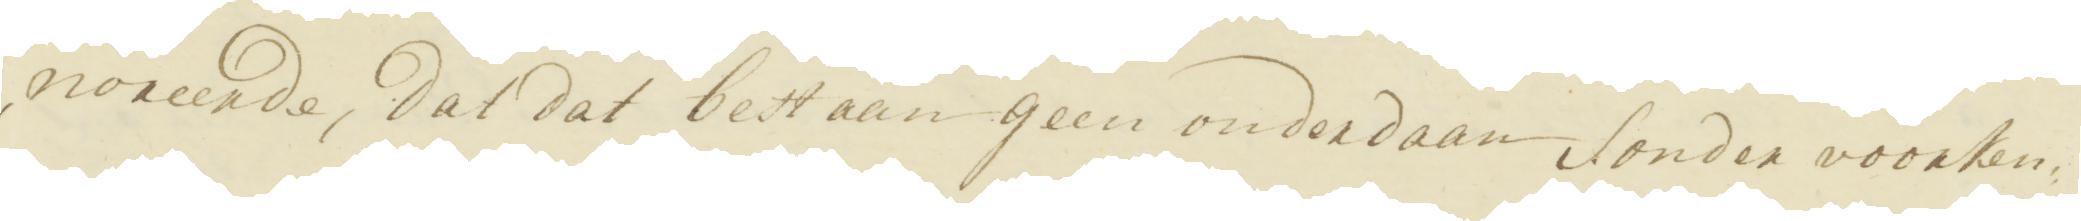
„noreerde, dat dat bestaan geen onderdaan sonder voorken„
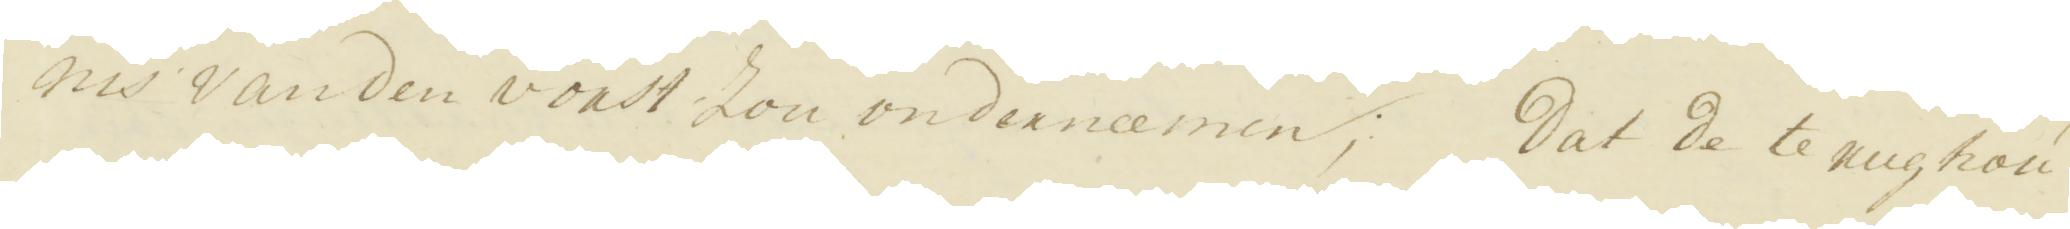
nis van den vorst zou onderneemen; dat de terughou
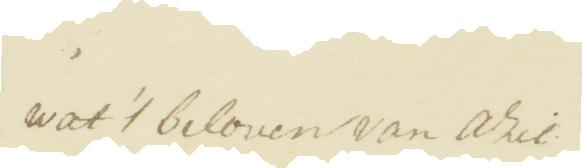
wat ’t beloven van azie
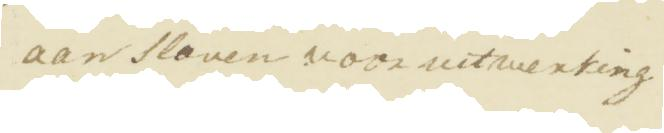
aan slaven voor uitwerking
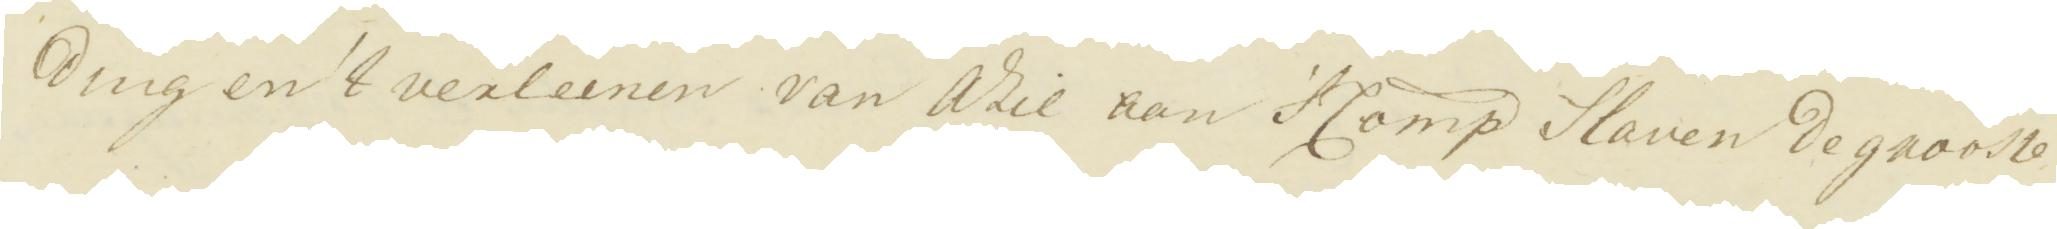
ding en’t verleenen van Azie aan ’sComp slaven de grooste
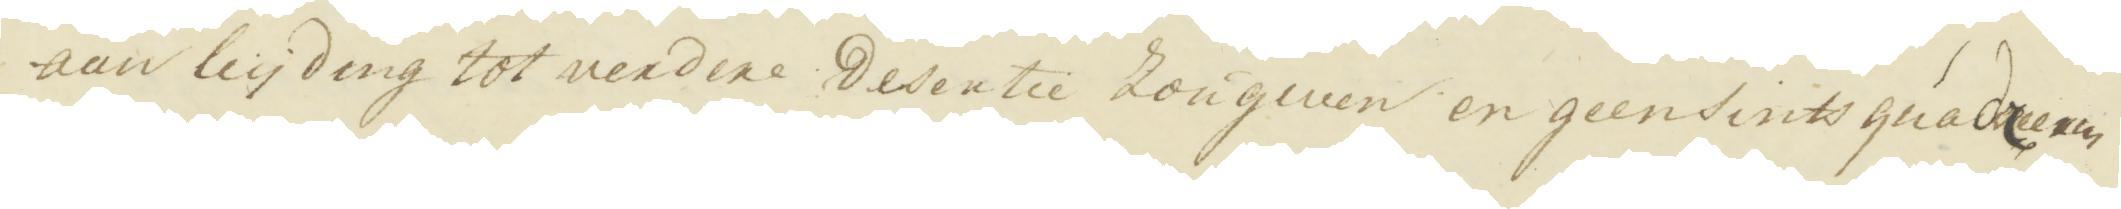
aan leijding tot verdere desertie zou geven en geensints quadreeren
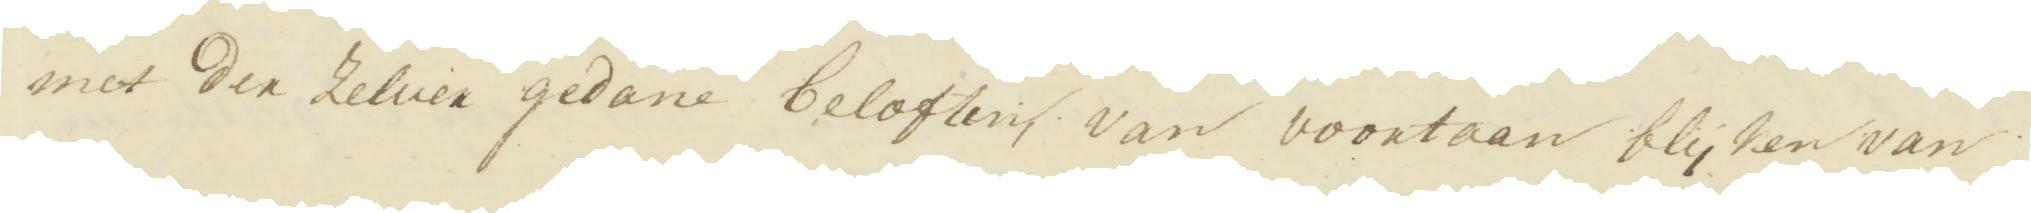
met der zelver gedane beloften, van voortaan blijven van
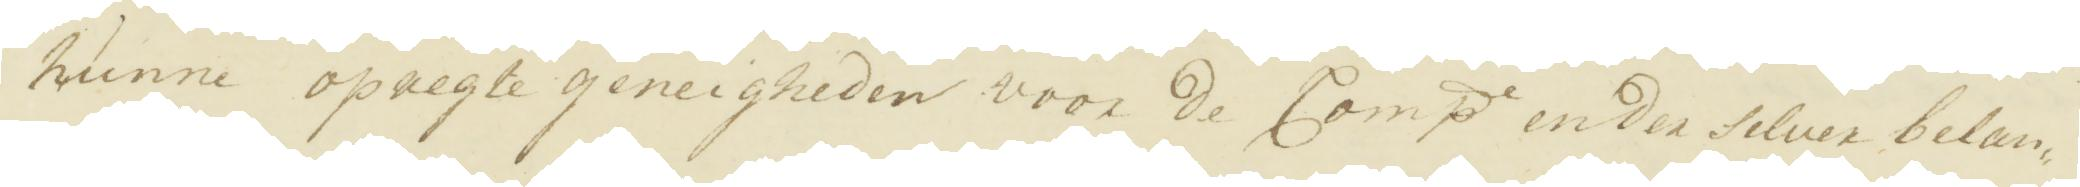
hunne opregte geneigheden voor de Compe en der selver belan„
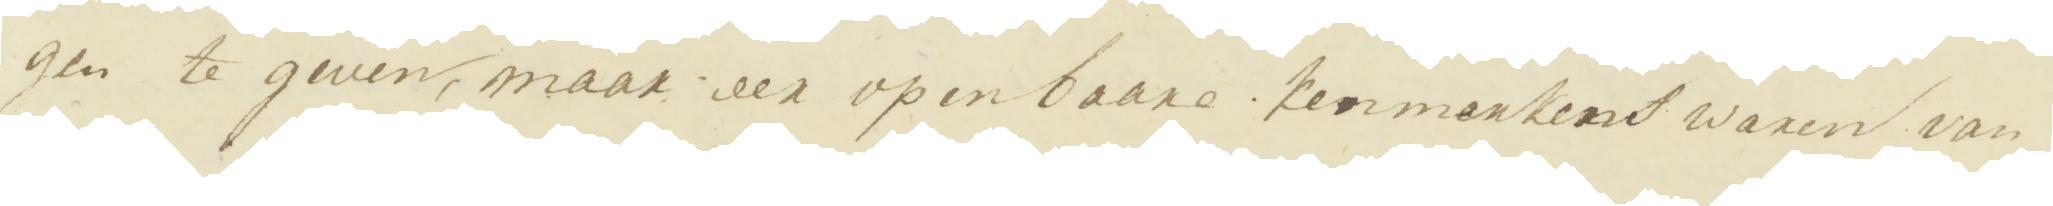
gen te geven, maar eer openbaare kenmerkens waren van
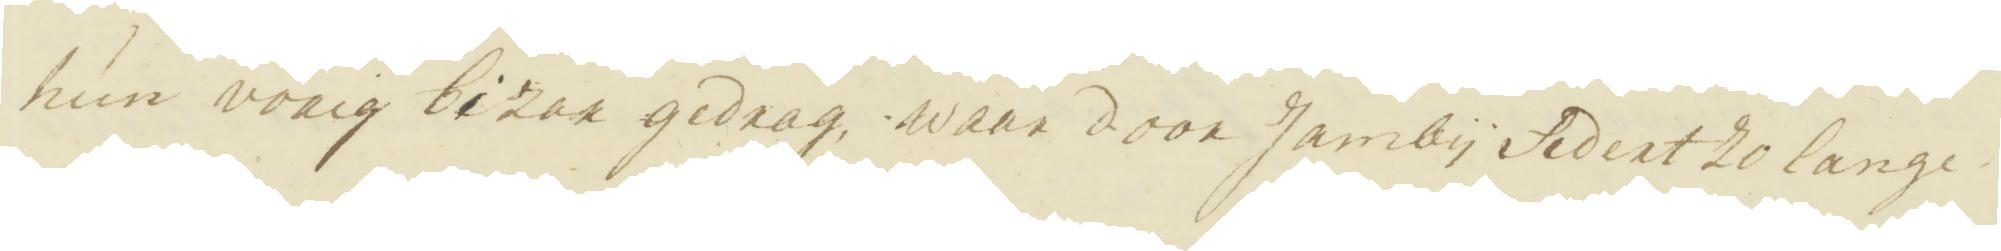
hun vorig bizar gedrag, waar door Jambij sedert zo lange
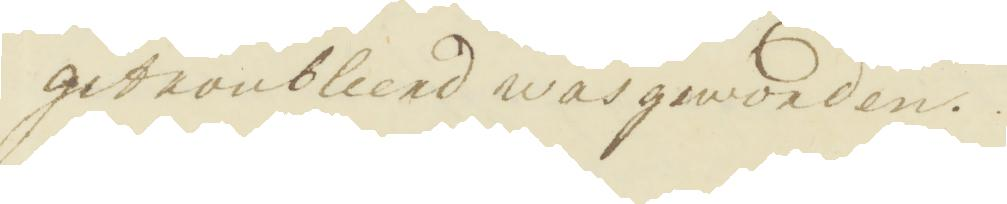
getroubleerd was geworden.
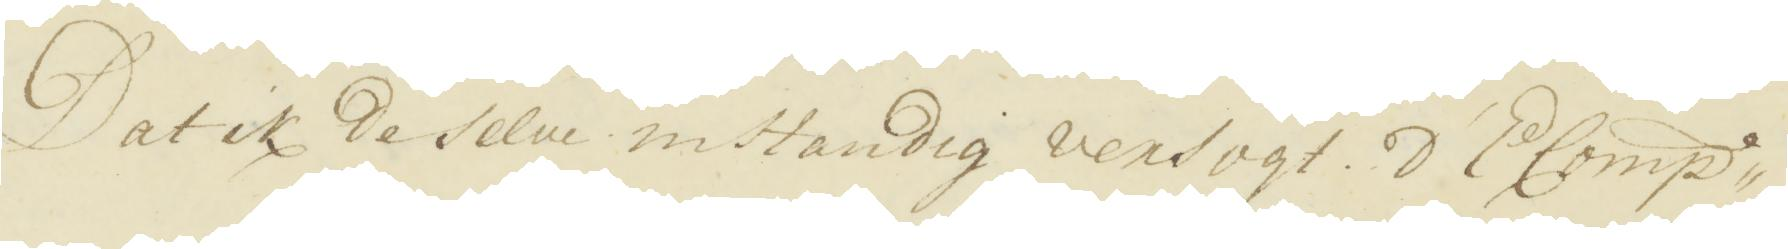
Dat ik de selve instandig versogt. d’E Comp„e
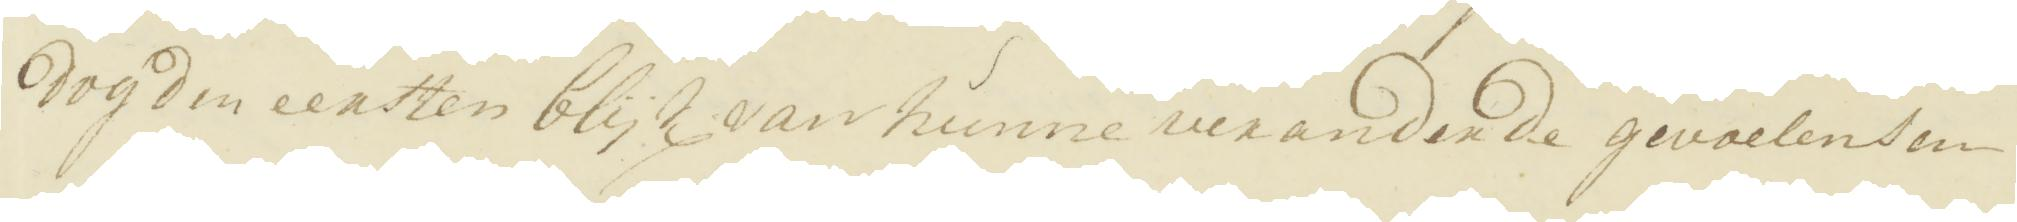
dog den eersten blijk van hunne veranderde gevoelens en
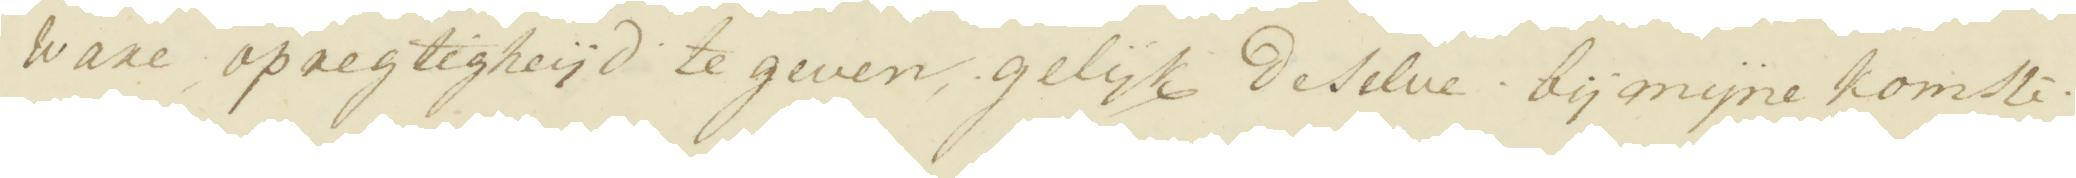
ware opregtigheijd te geven, gelijk deselve bij mijne komste
